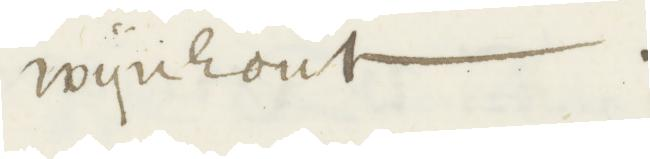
wijnhout.
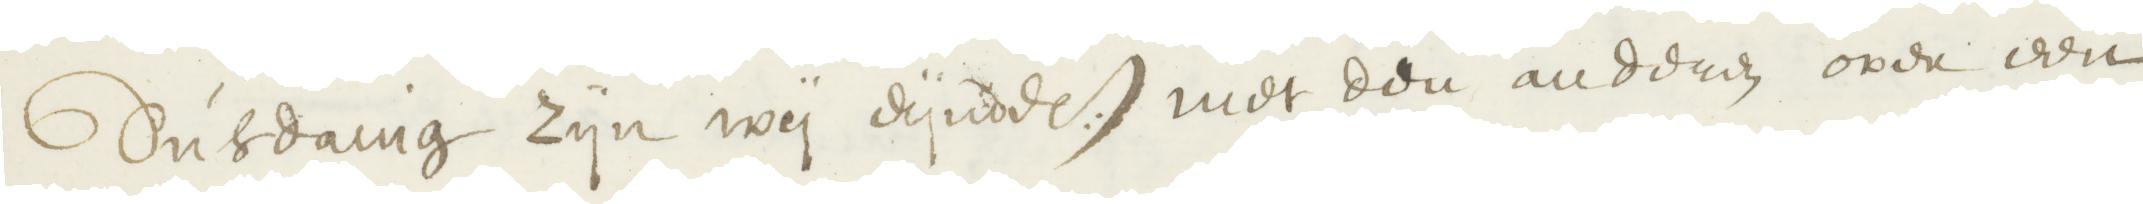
dusdanig zijn wij eijndelijk met den anderen over een
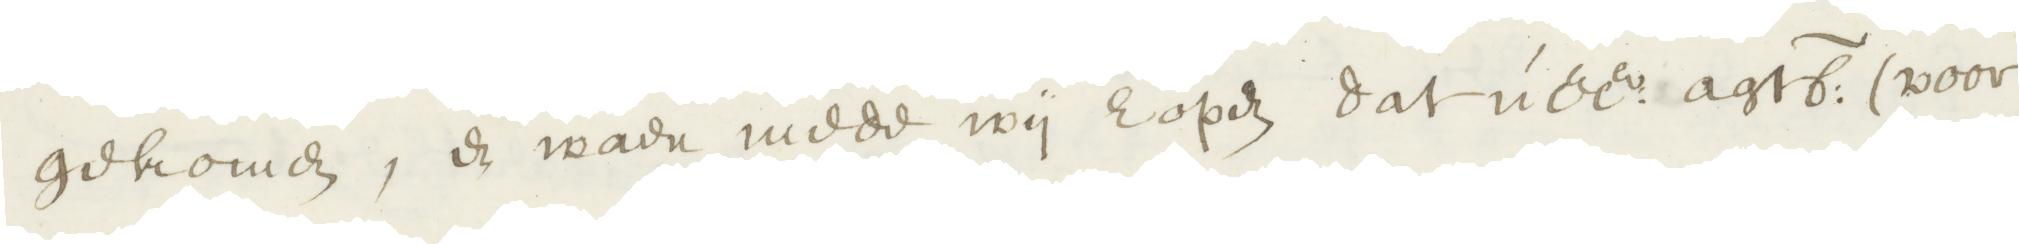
gekomen, en waer mede wij hopen dat uEE: agtb: (voor
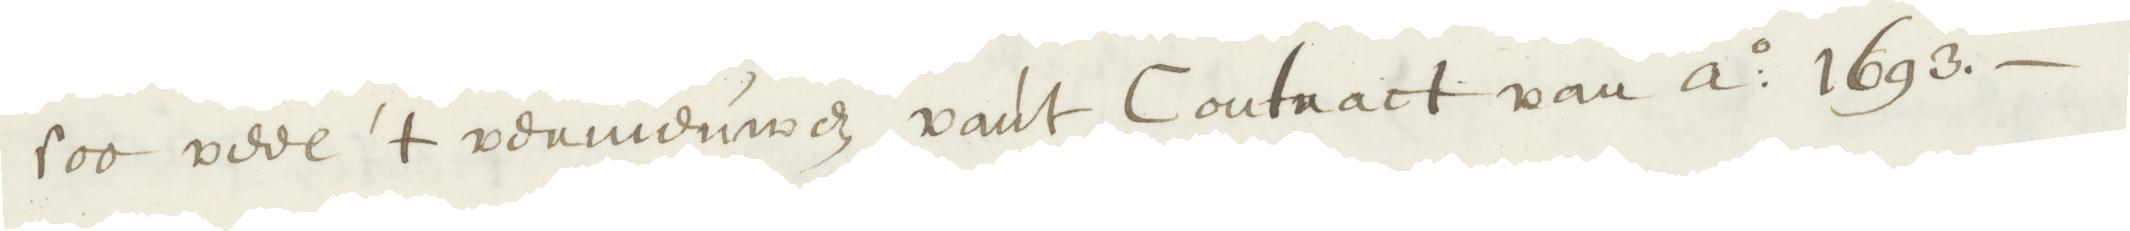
soo veel ’t vernieuwen van’t Contract van a:o 1693. —
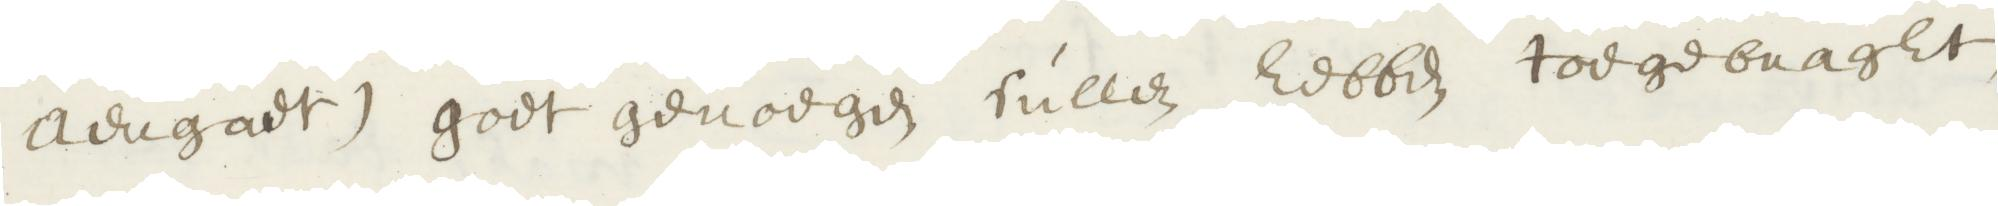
aengaet) goet genoegen sullen hebben toegebraght
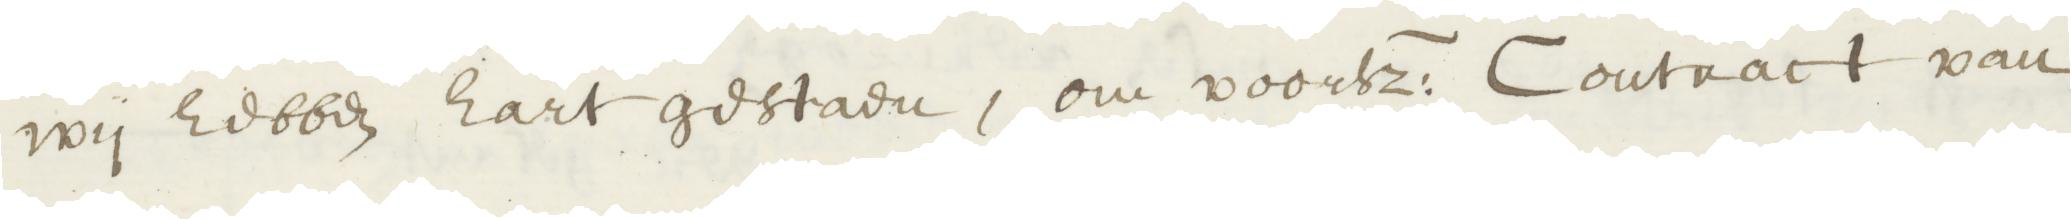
wij hebben hart gestaen, om voorsz: Contract van
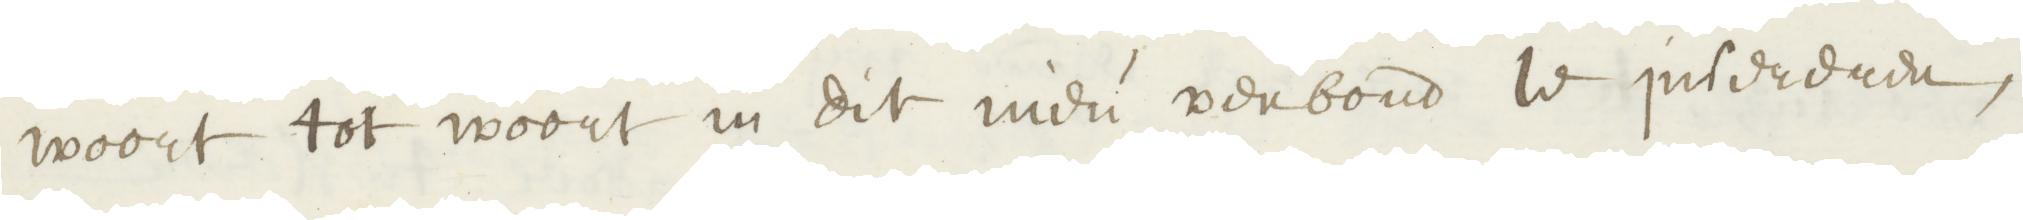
woort tot woort in dit nieu verbond te jnsereren,
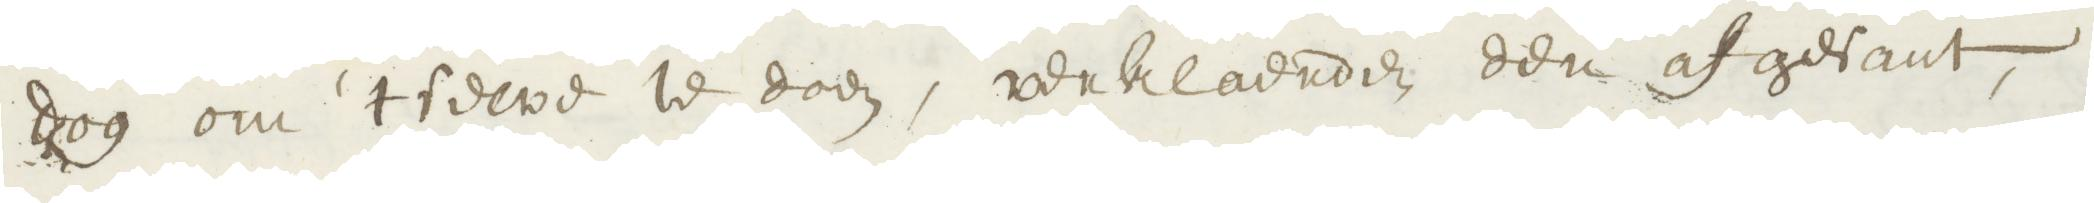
dog om ’t selve te doen, verklaerden den afgesant,
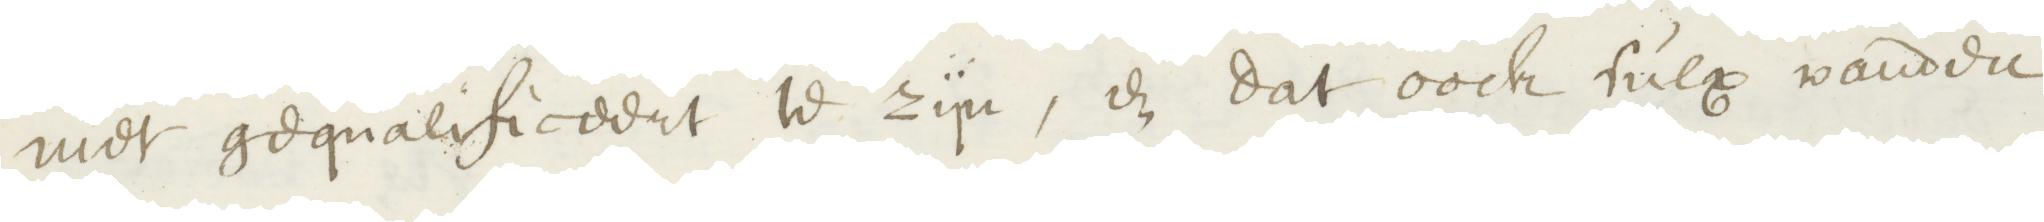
niet gequalificeert te zijn, en dat oock sulx vanden
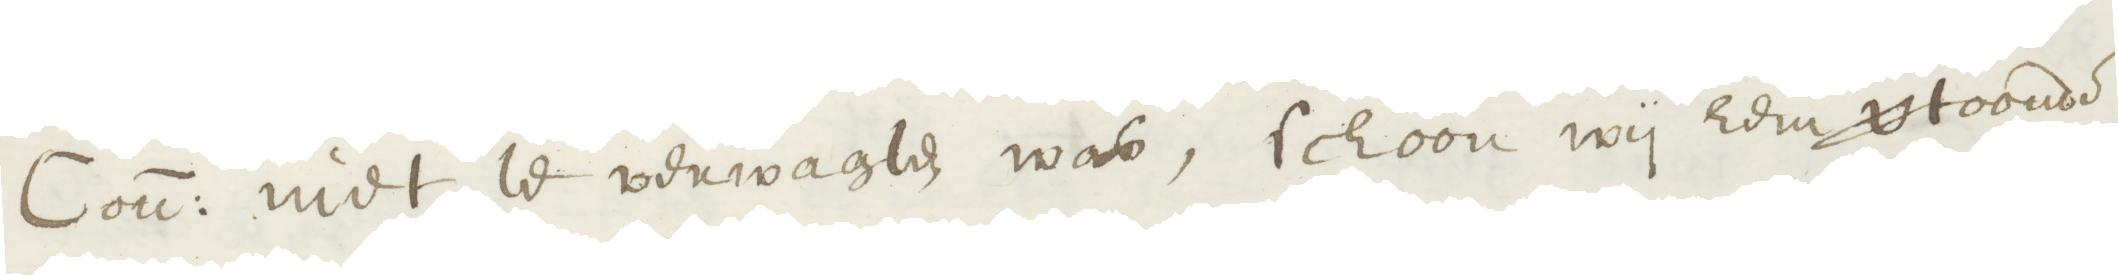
Con: niet te verwagten was, schoon wij hem vertoonde
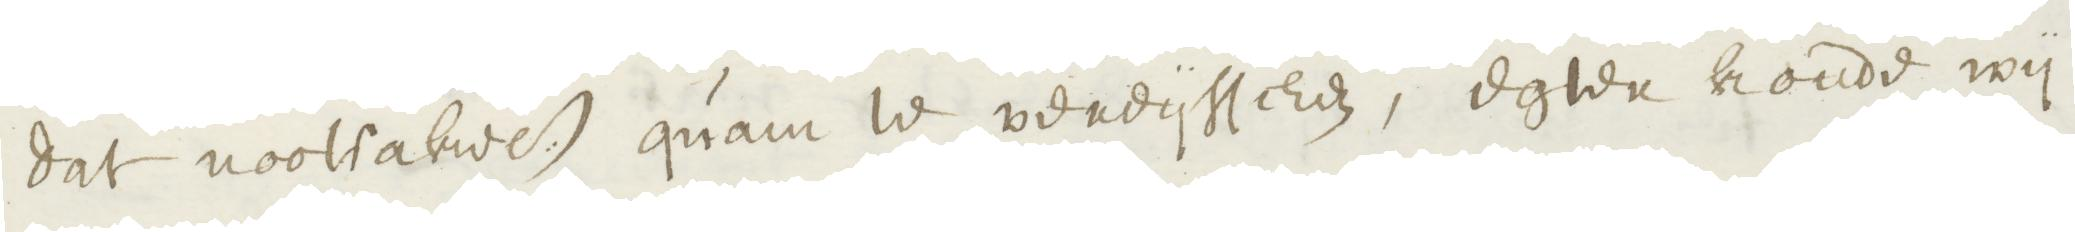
dat nootsakelijk quam te vereijsschen, egter konde wij
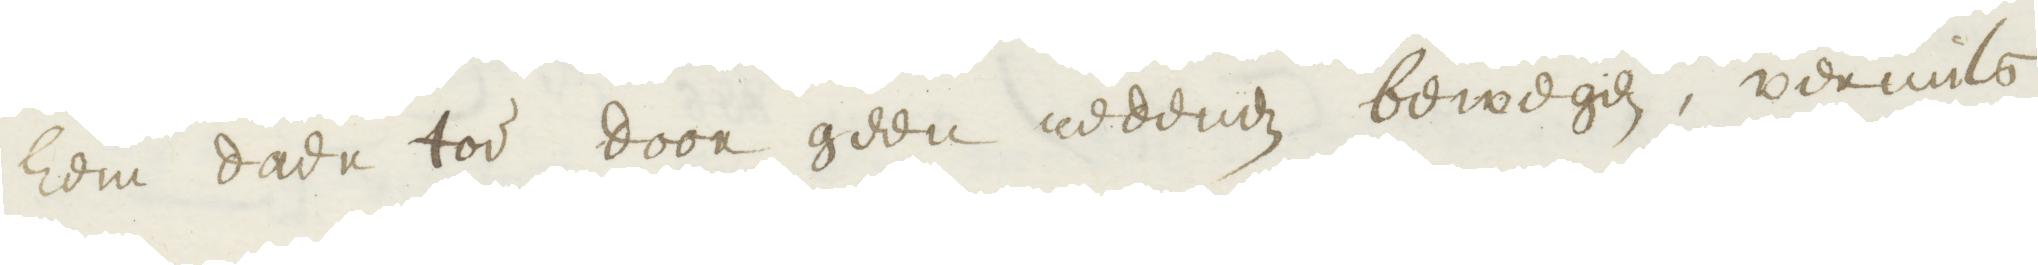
hem daer toe door geen redenen bewegen, vermits
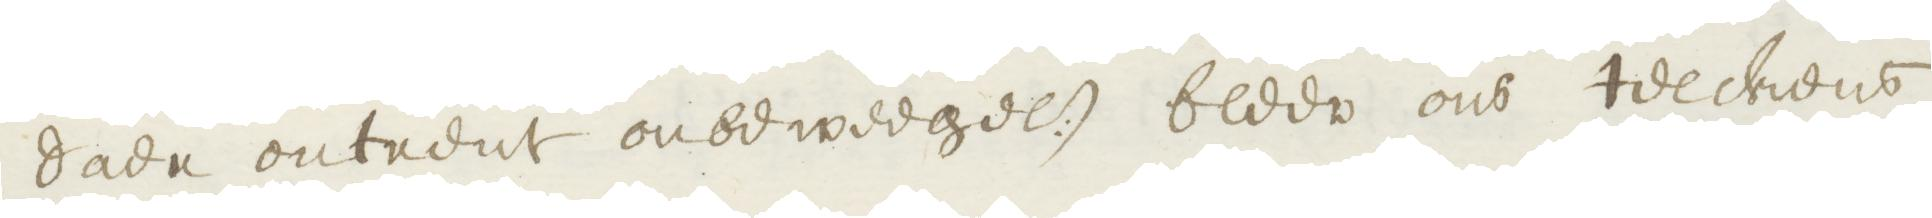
daer ontrent onbeweegelijk bleev ons telckens
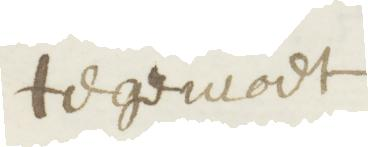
tegemoet
